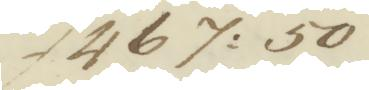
ƒ467: 50
